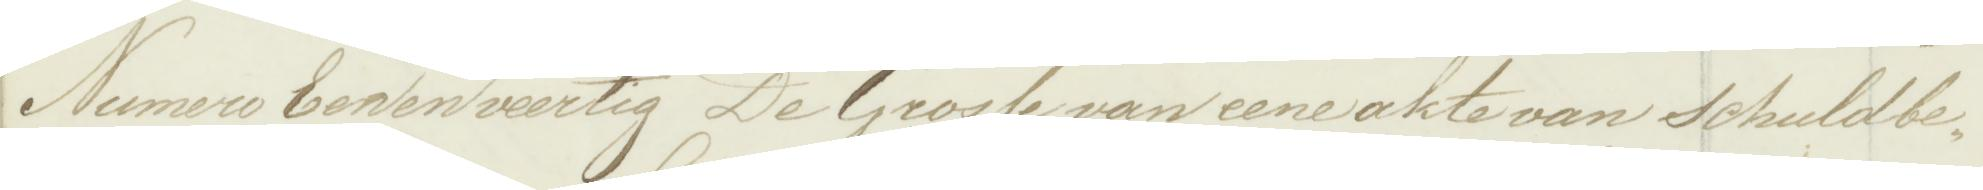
Numero Een en veertig De Grosse van eene akte van Schuldbe„
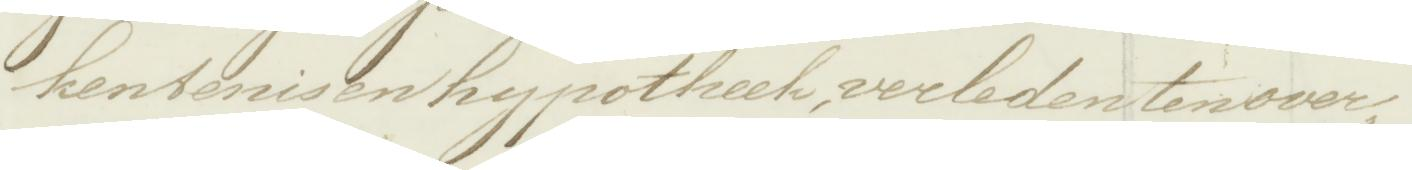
kentenis en hypotheek, verleden ten over„
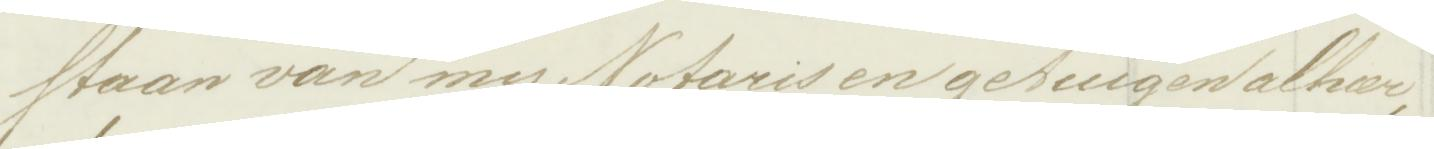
staan van my Notaris en getuigen alhier,
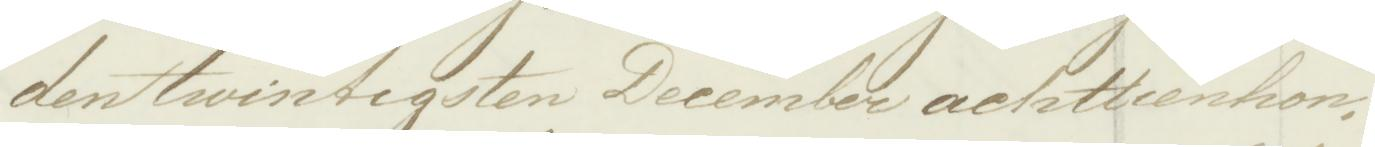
den twintigsten December achttienhon„
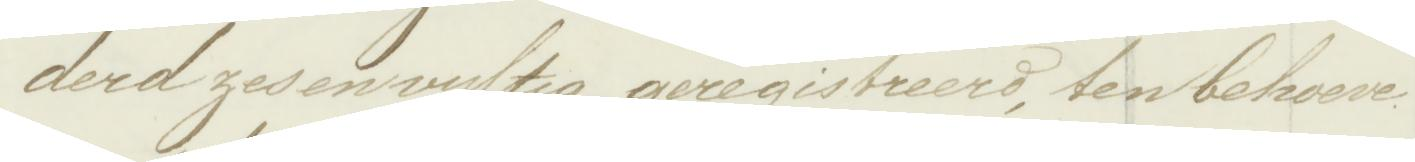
derd zes en vyftig, geregistreerd, ten behoeve
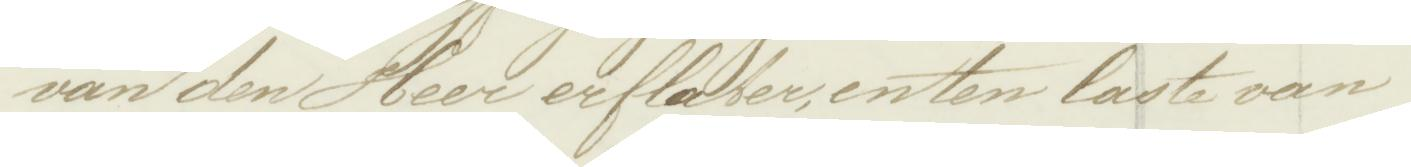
van den Heer erflater, en ten laste van
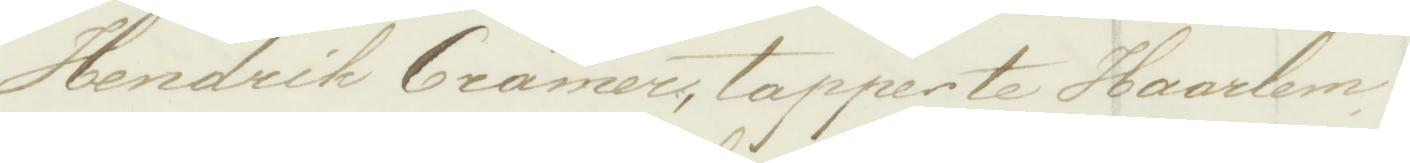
Hendrik Cramer, tapper te Haarlem,
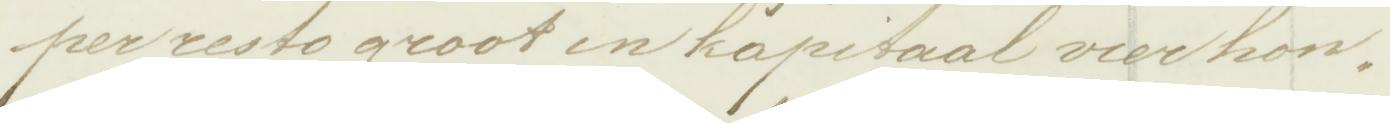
per resto groot in kapitaal vier hon„
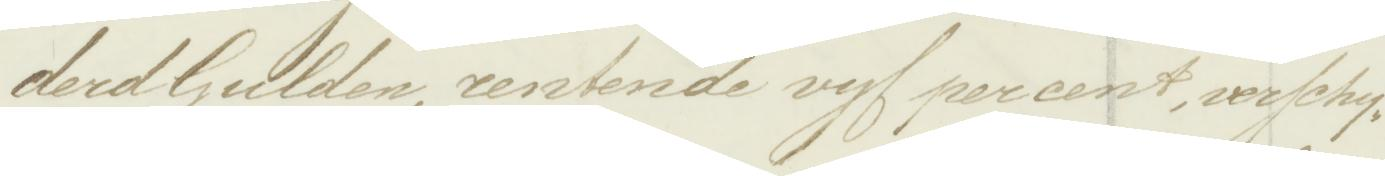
derd Gulden, rentende vyf per cent, verschy
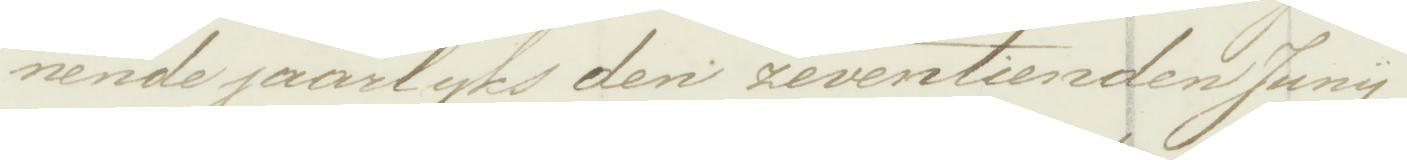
nende jaarlyks den zeventienden Junij
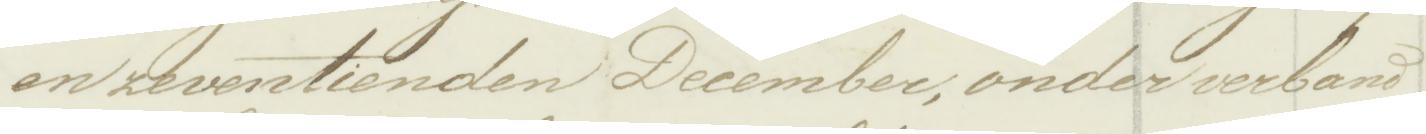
en zeventienden December, onder verband
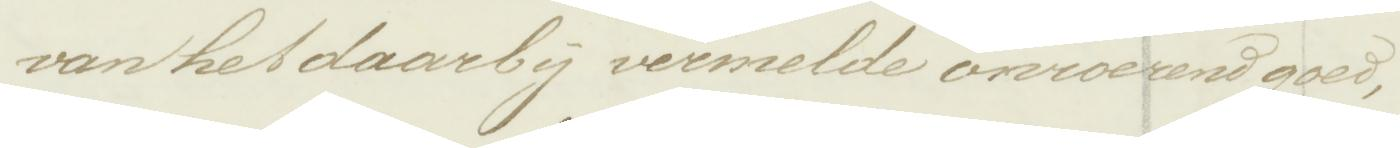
van het daarbij vermelde onroerend goed,
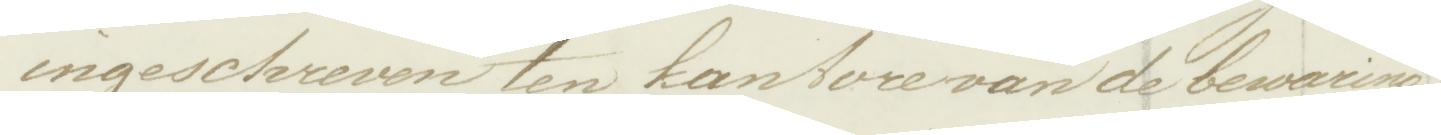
ingeschreven ten kantore van de bewaring
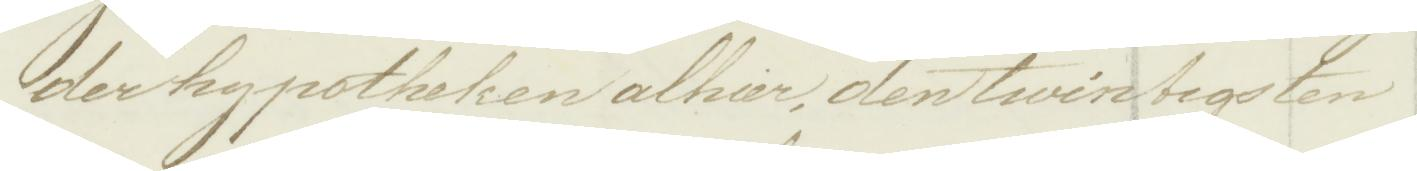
der hypotheken alhier, den twintigsten
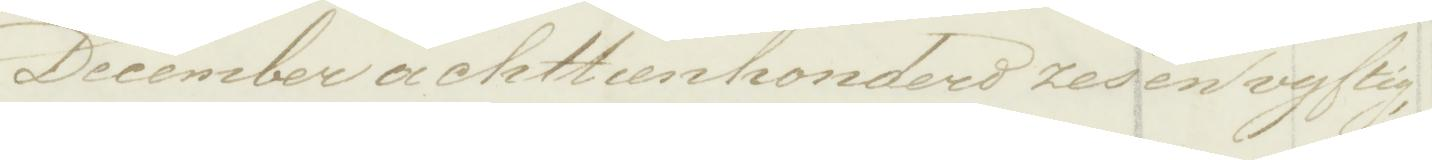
December achttienhonderd zes en vyftig,
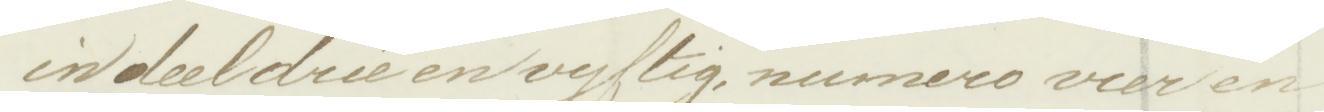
in deel drie en vyftig, numero vier en
